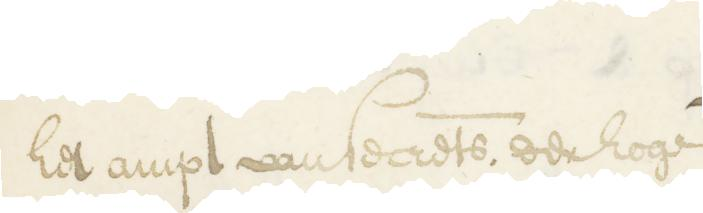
het ampt van secrets. der hoge
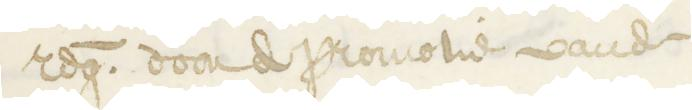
reg. door de promotie van de
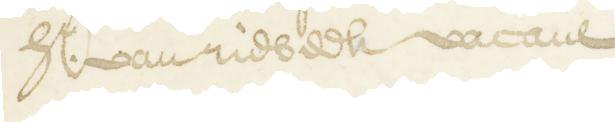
h.r van riebeek vacant
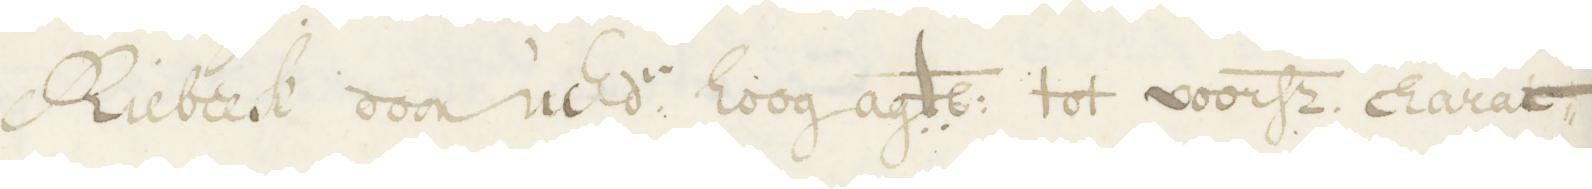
Riebeek door uEd:e hoog agtb: tot voorsz. charac„
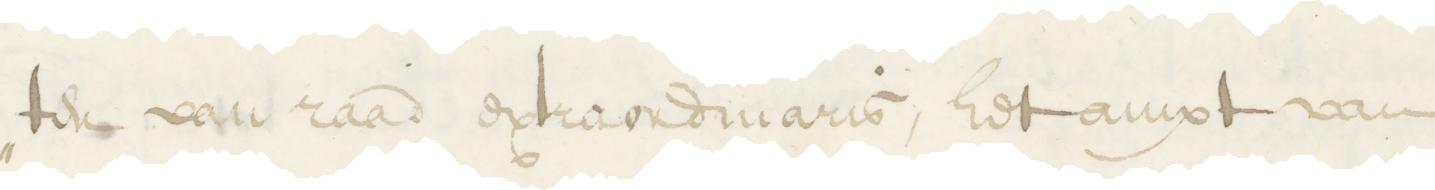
ter van raad extraordinaris, het ampt van
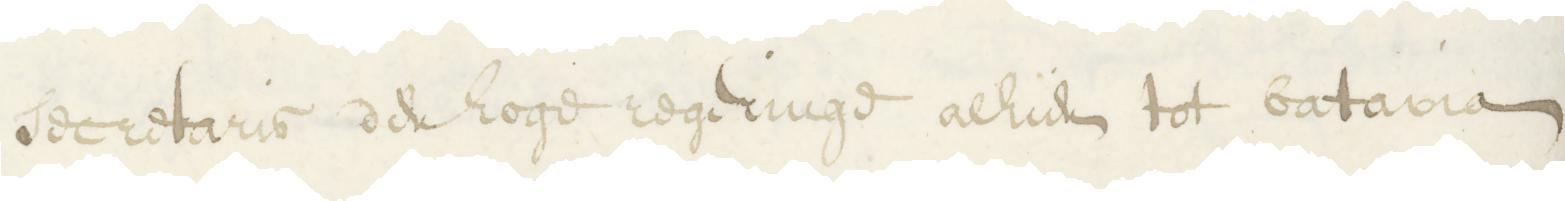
secretaris der hoge regeringe alhier tot batavia
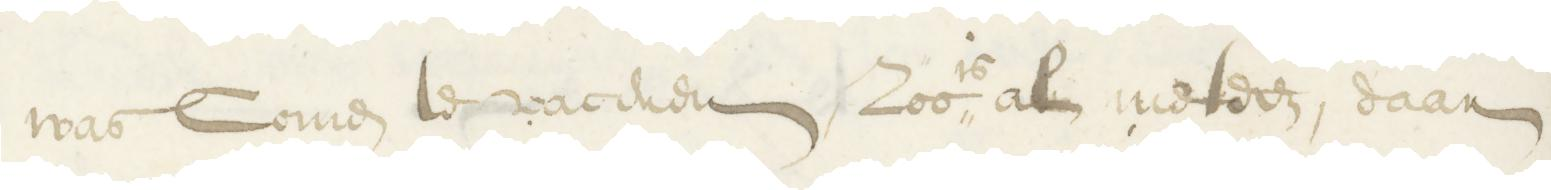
was comen te vaceren, zoo„is al meteen, daar
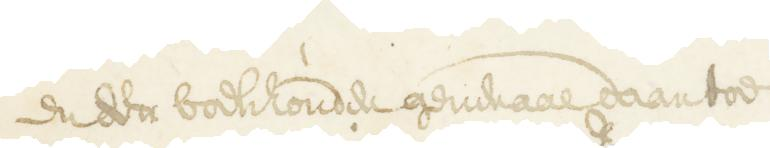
en den boekhouden generaal daar toe
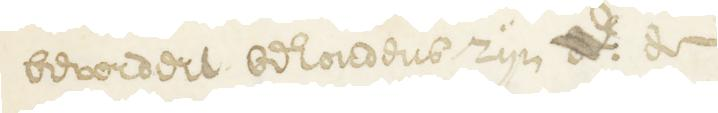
bevordert behoudens zijn E: de
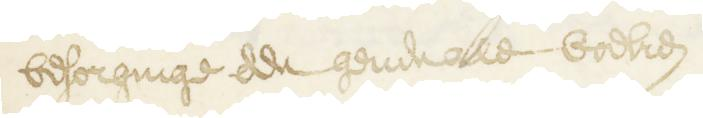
besorginge den generale boeken
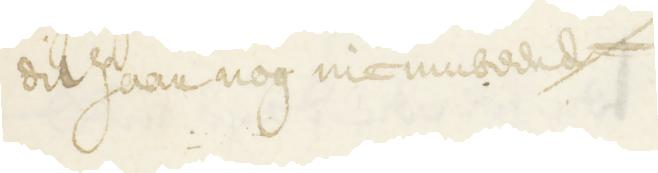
dit Jaar nog incumbeerde
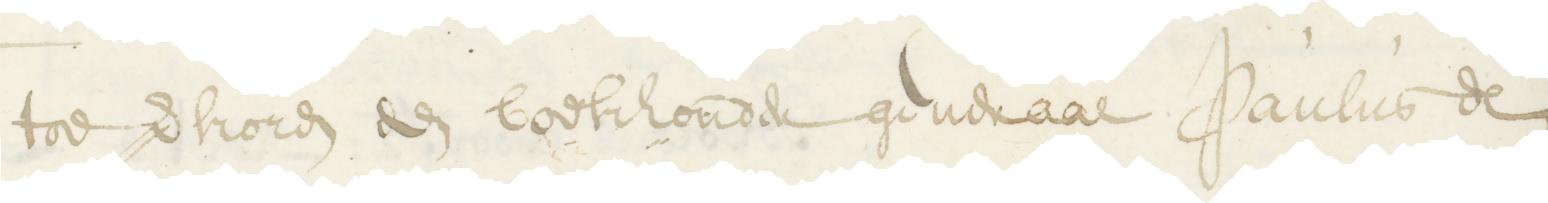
toe verkoren den boekhouden generaal Paulus de
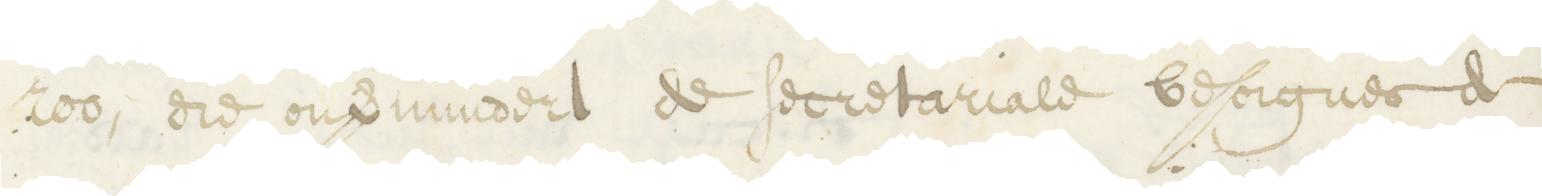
Roo, die onvermindert de secretariale besoignes de
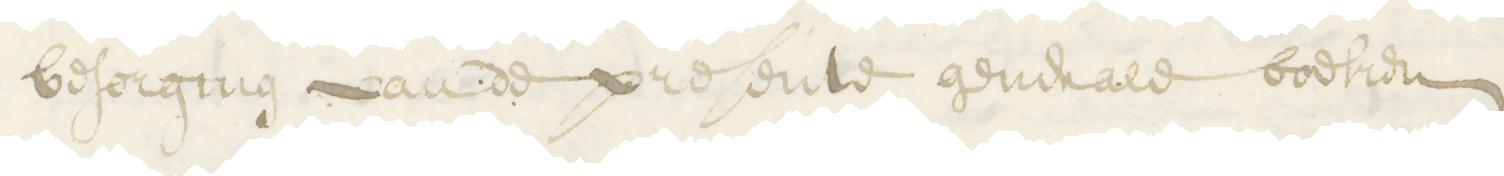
besorging van de presente generale boeken
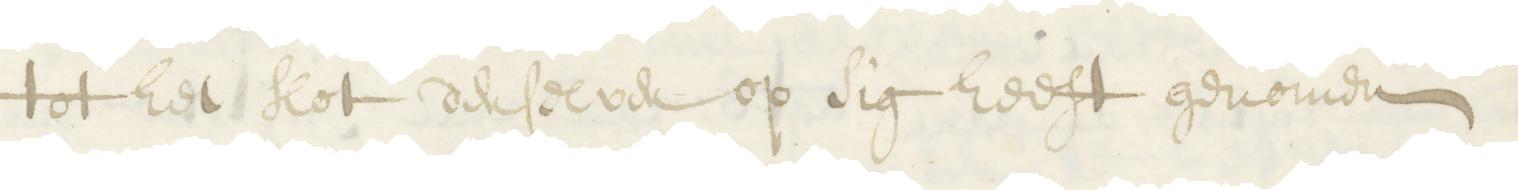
tot het slot derselver op sig heeft genomen
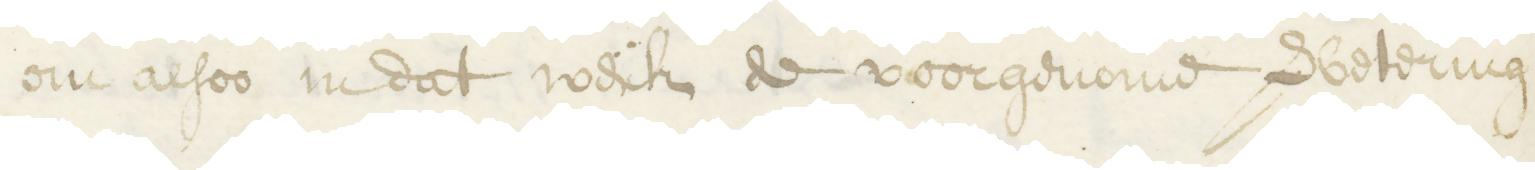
om alsoo in dat werk de voorgenome verbetering
